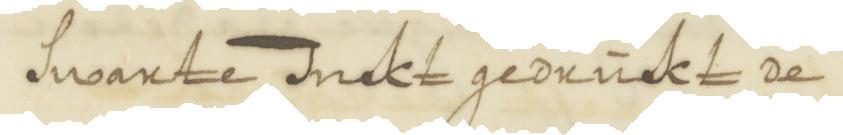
swarte Inkt gedrukt de
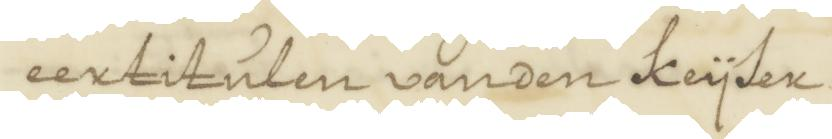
eertitulen van den keijser
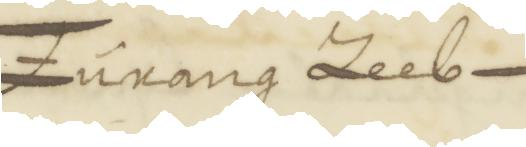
Eurang zeeb —
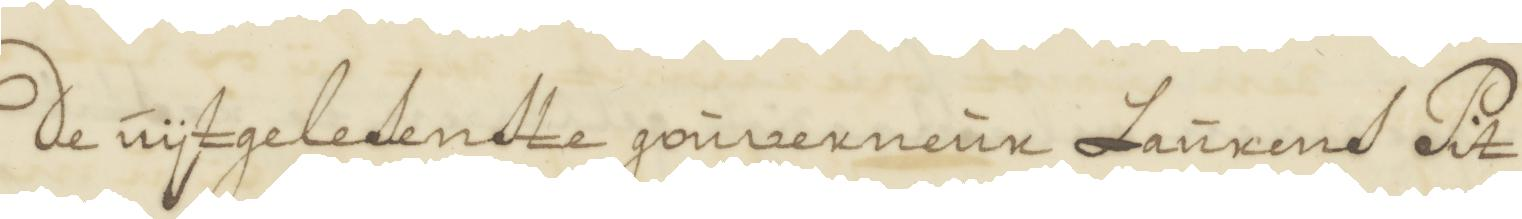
De uijtgelesenste gouverneur Laurens Pit
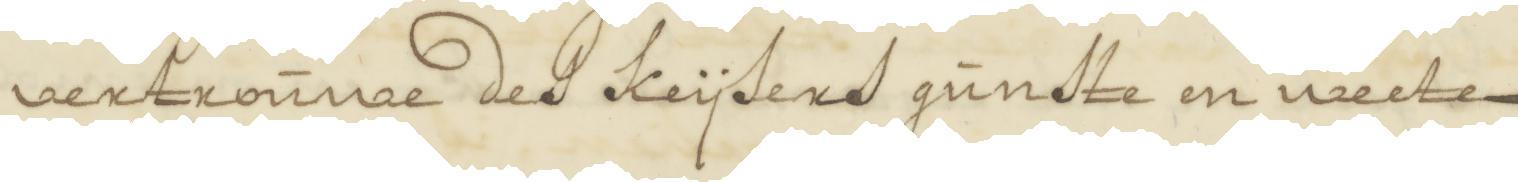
vertrouwe des keijsers gunste en weete
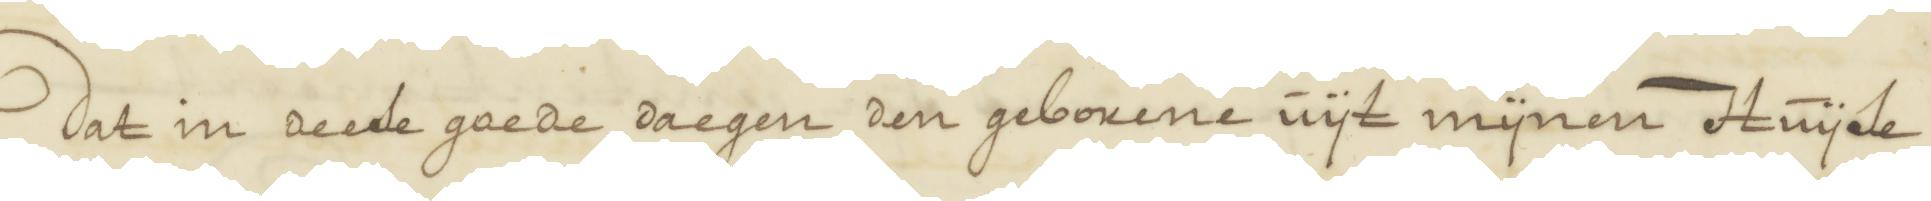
dat in deese goede daegen den geborene uijt mijnen Huijse
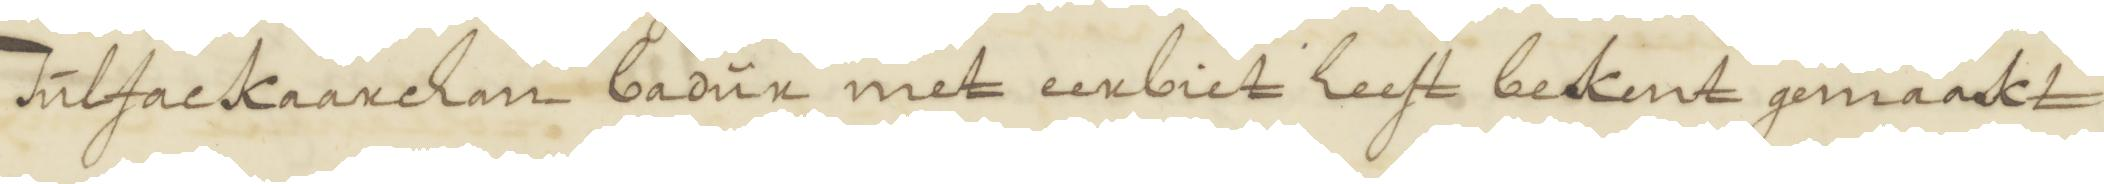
Iulfackaarchan badur met eerbiet heeft bekent gemaakt
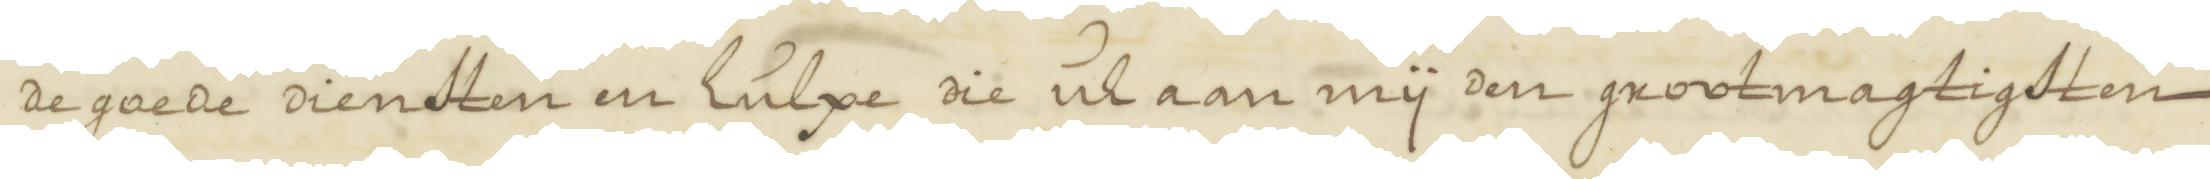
de goede diensten en hulpe die uh aan mij den grootmagtigsten
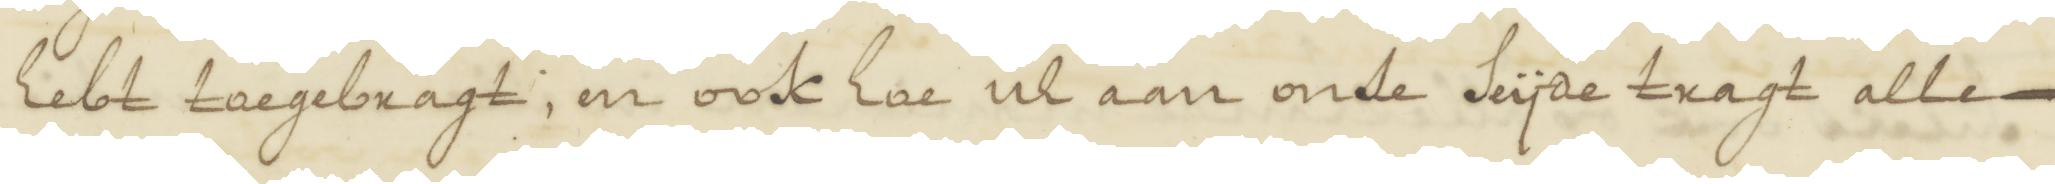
hebt toegebragt; en ook hoe uh aan onse seijde tragt alle
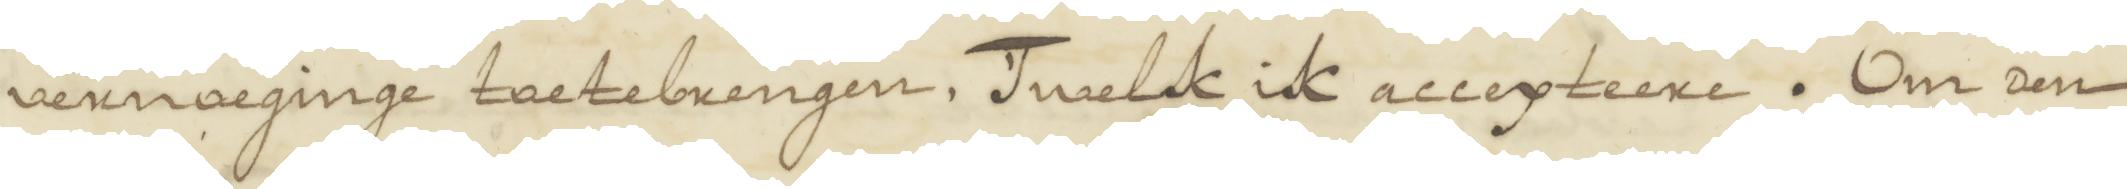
vernoeginge toe tebrengen. 'Twelk ik accepteere. Om den
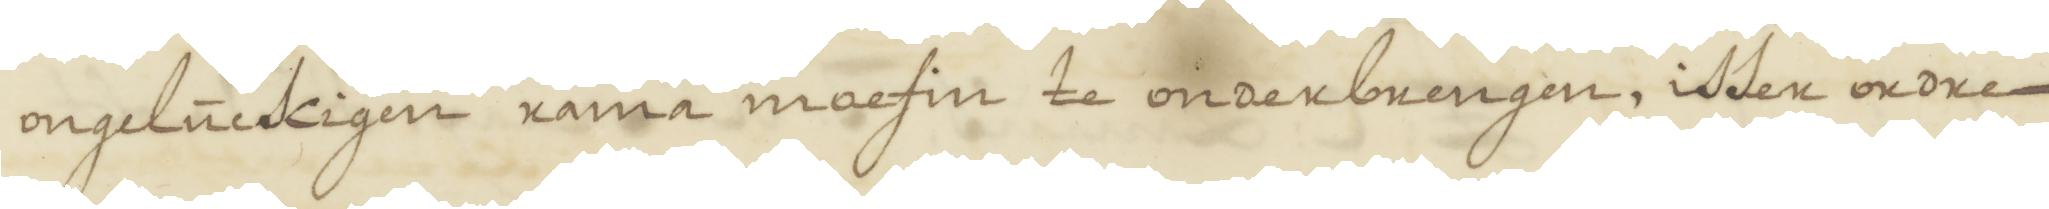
ongeluckigen rama moefin te onderbrengen, isser ordre
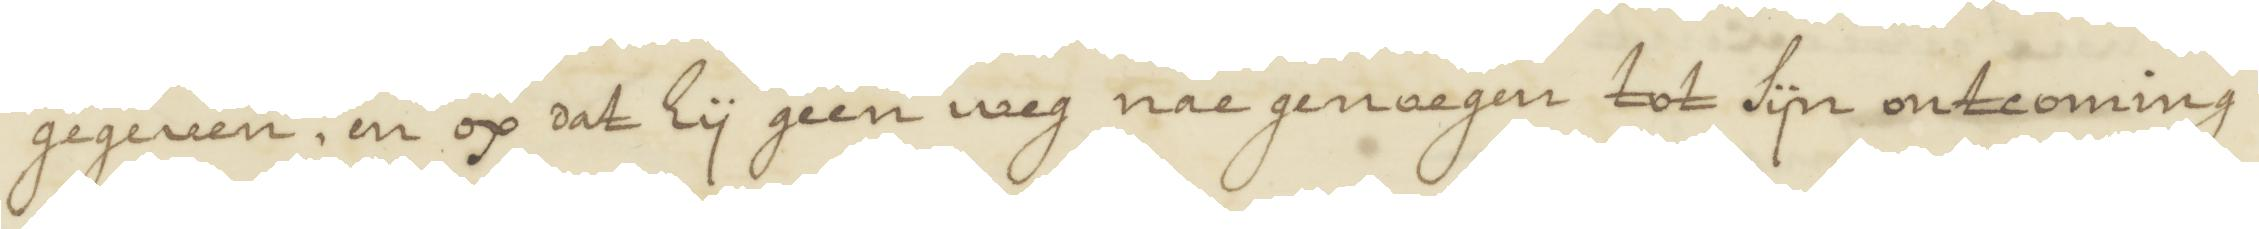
gegeven, en op dat hij geen weg nae genoegen tot sijn ontcoming
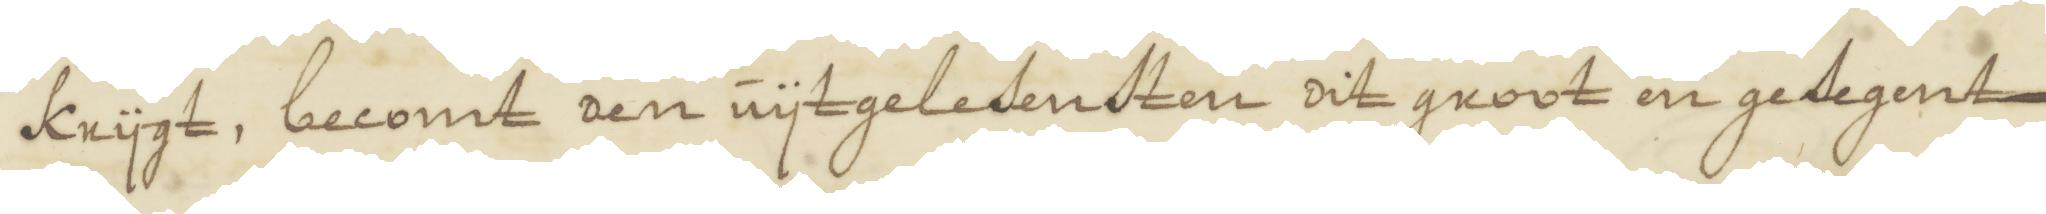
krijgt, becomt den uijtgelesensten dit groot en gesegent
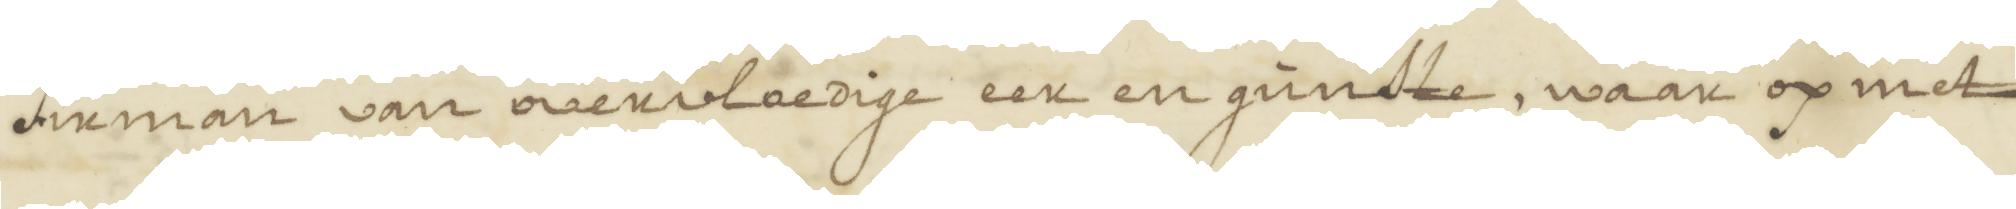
Firman van overvloedige eer en gunste, waar op met
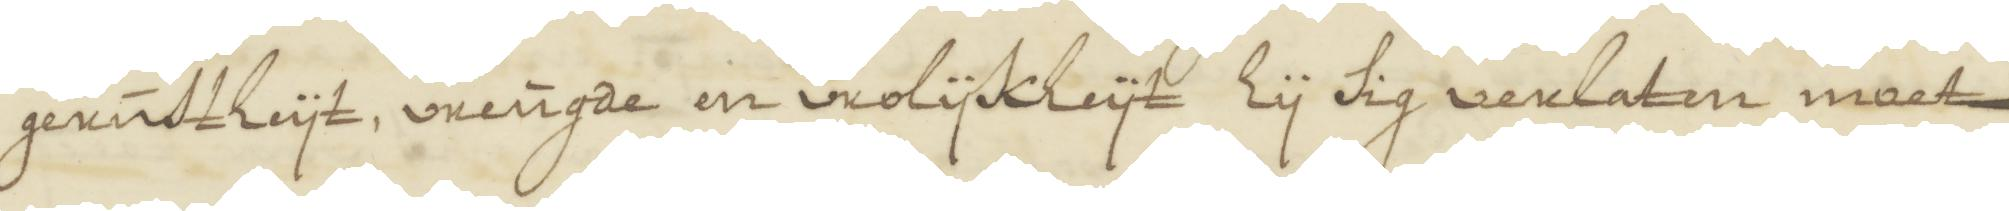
gerustheijt, vreugde en vrolijkheijt hij sig verlaten moet
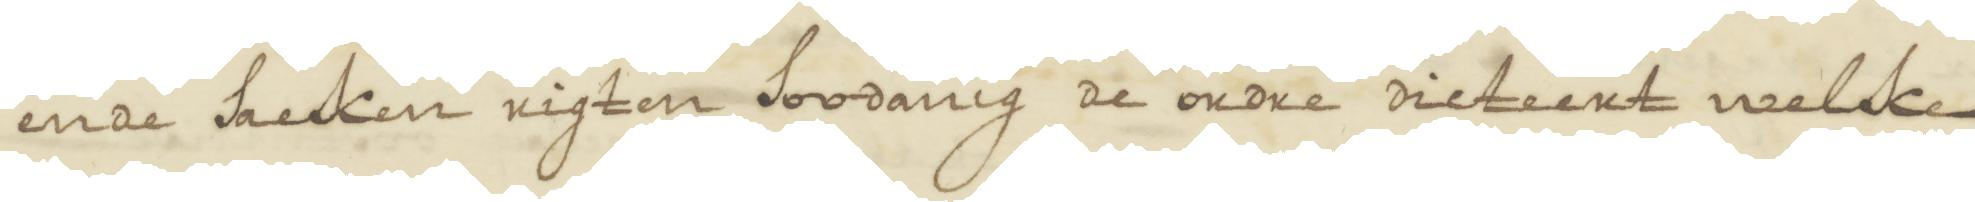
en de saeken rigten soodanig de ordre dicteert welke
